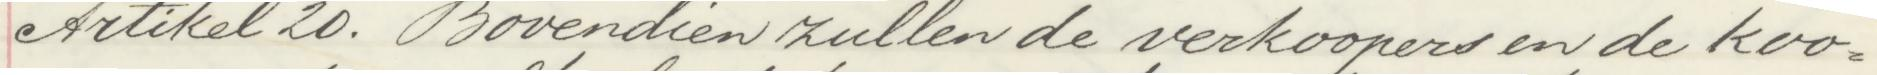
Artikel 20. Bovendien zullen de verkoopers en de koo„
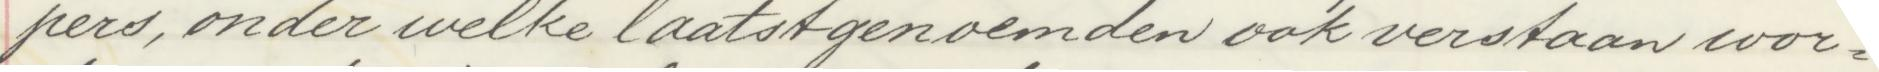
pers, onder welke laatstgenoemden ook verstaan wor=
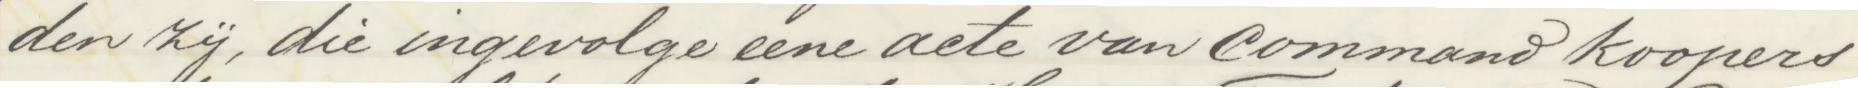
den zij, die ingevolge eene acte van command koopers
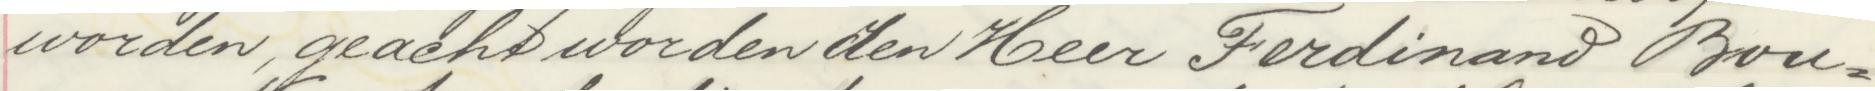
worden, geacht worden den Heer Ferdinand Bou=
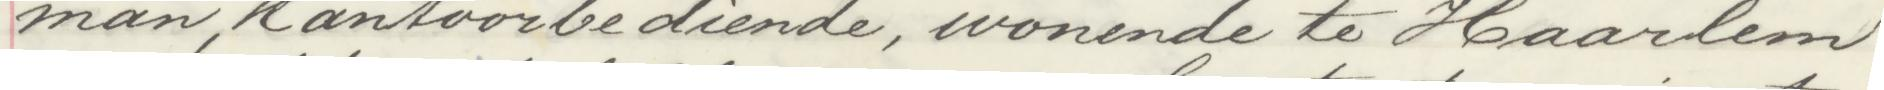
man, Kantoorbediende, wonende te Haarlem
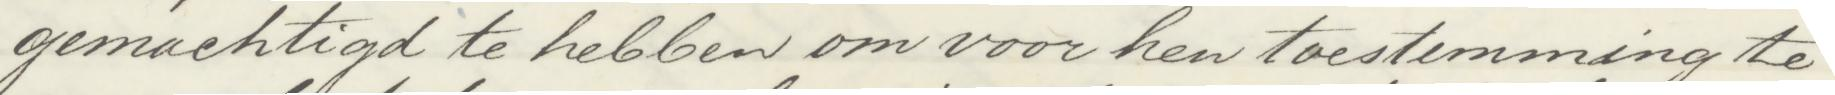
gemachtigd te hebben om voor hen toestemming te
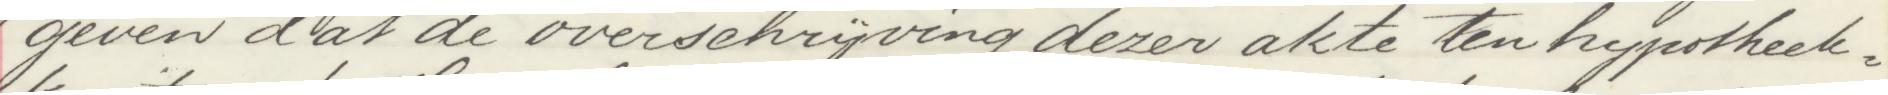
geven dat de overschrijving dezer akte ten hypotheek=
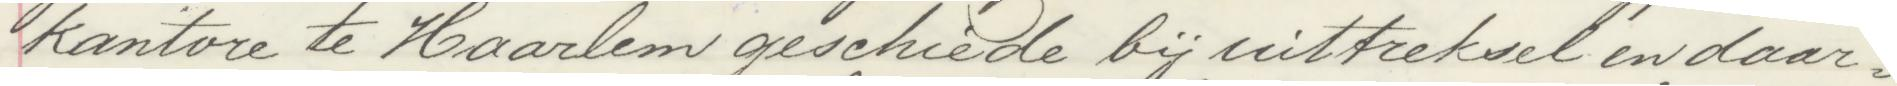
kantore te Haarlem geschiede bij uittreksel en daar=
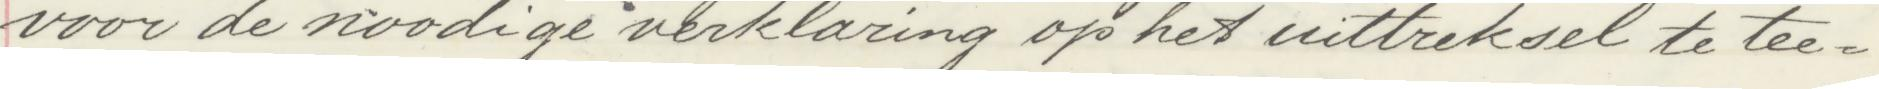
voor de noodige verklaring op het uittreksel te tee=
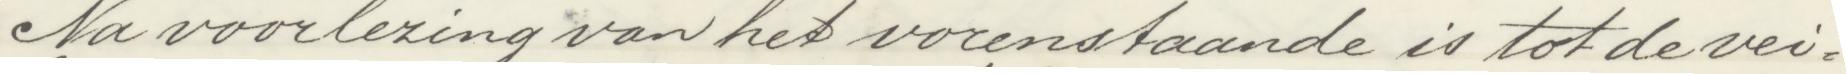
Na voorlezing van het vorenstaande is tot de vei=
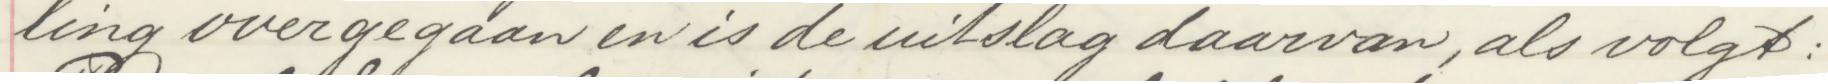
ling overgegaan en is de uitslag daarvan, als volgt:
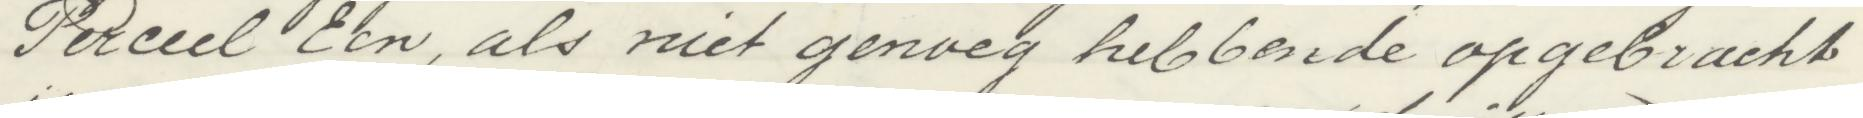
Perceel Een, als niet genoeg hebbende opgebracht
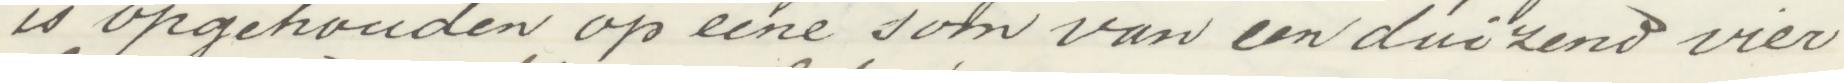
is opgehouden op eene som van een duizend vier
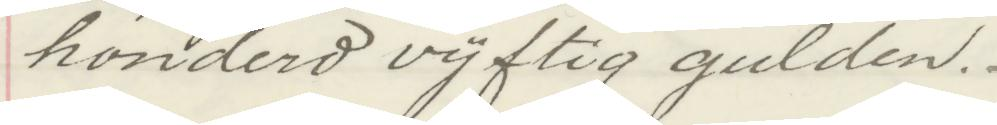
honderd vijftig gulden.
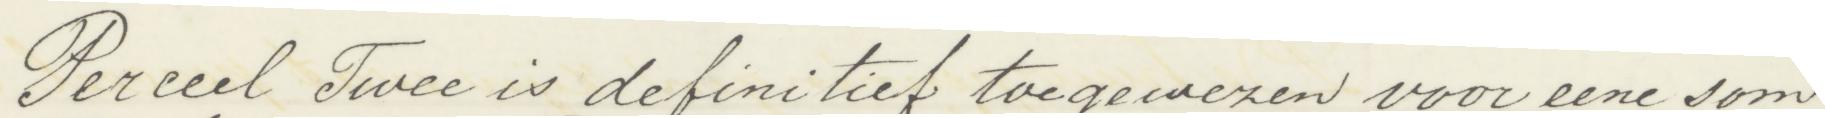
Perceel Twee is definitief toegewezen voor eene som
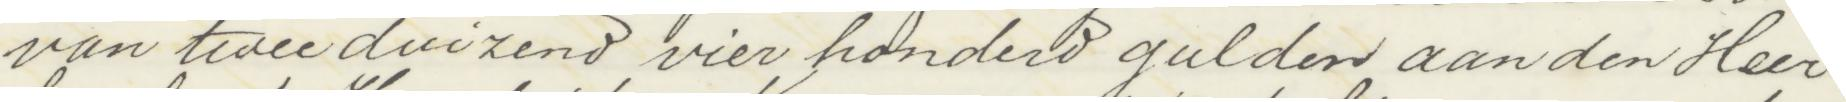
van twee duizend vier honderd gulden aan den Heer
